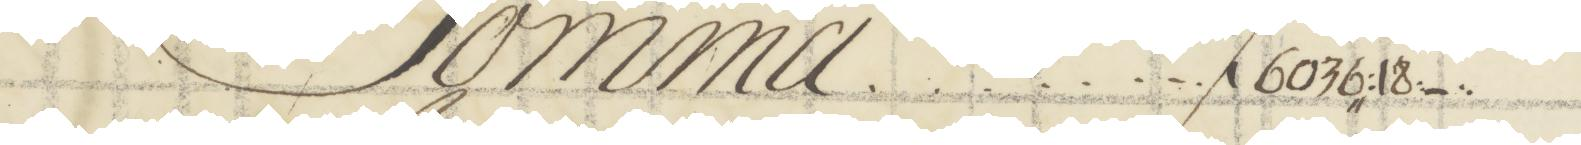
Somma . . . . . . -. ƒ 6036„: 18: —:
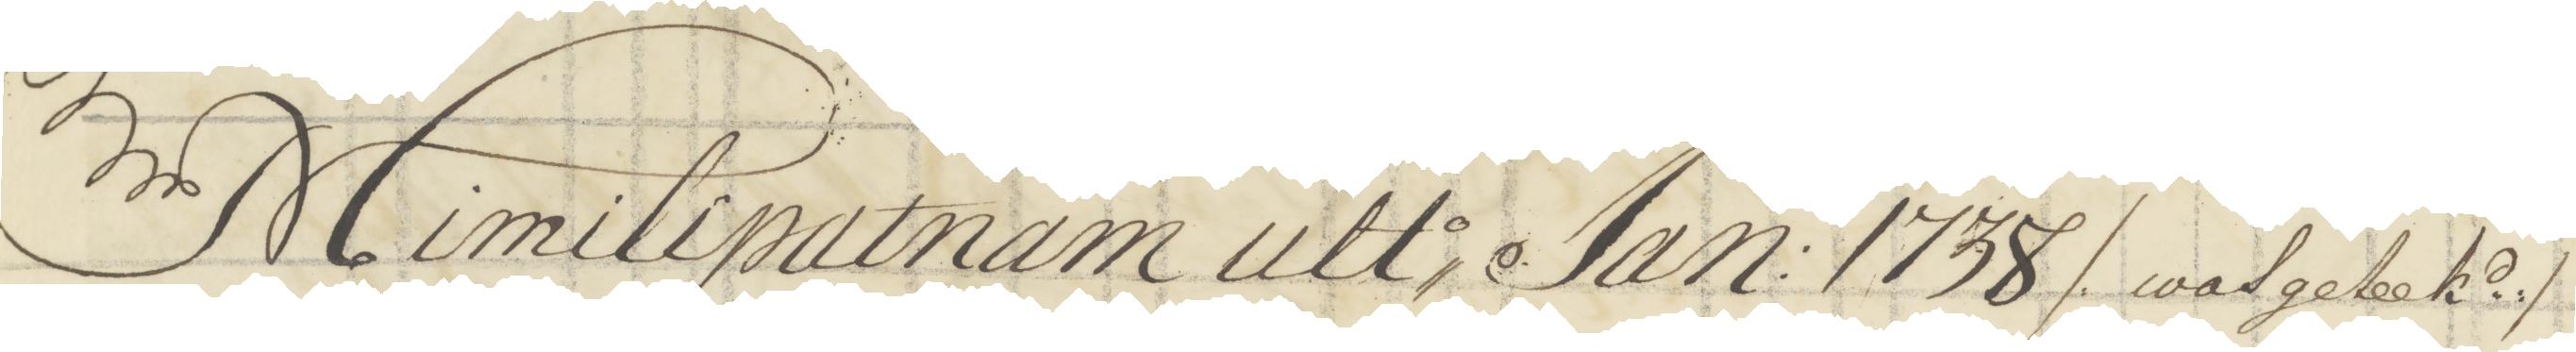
Mimilipatnam ult„o Ian: 1738 /:was geteek„d:/
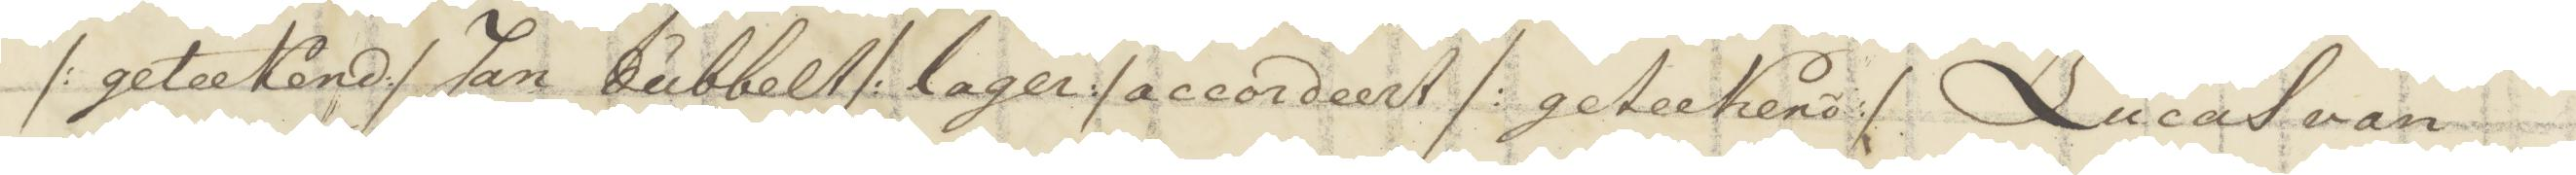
/:geteekend:/ Jan dubbelt /:lager:/ accordeert /:geteekend:/ Lucas van
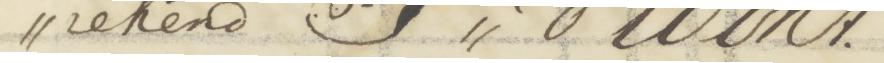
„rekend P„r d' Wint
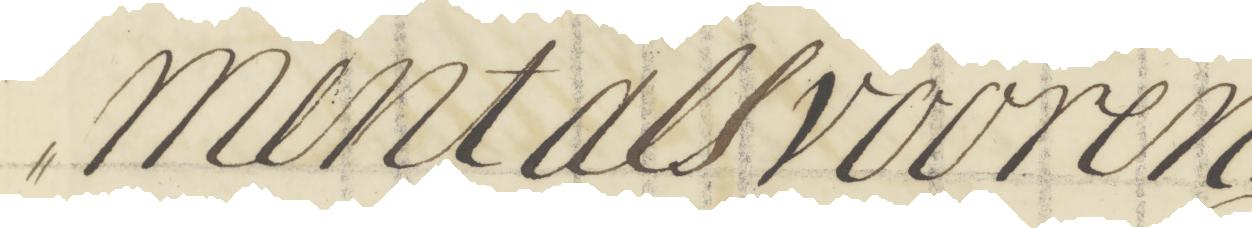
„ment als vooren
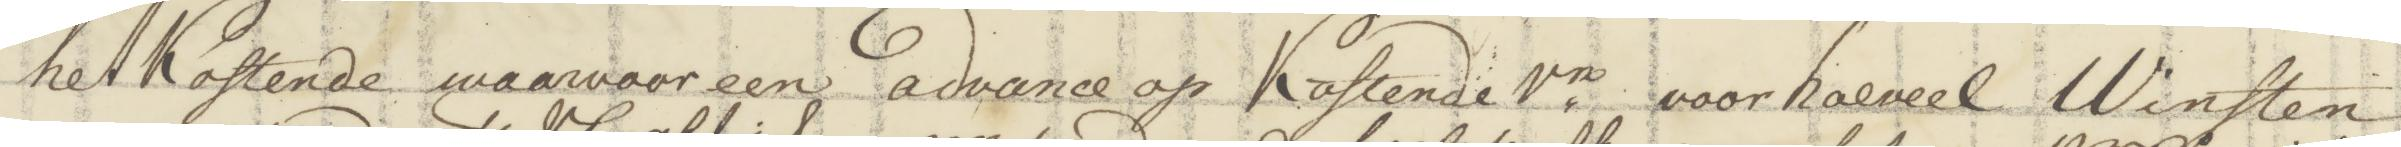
het kostende waarvoor een advance op Kostende V„n voor hoeveel Winsten
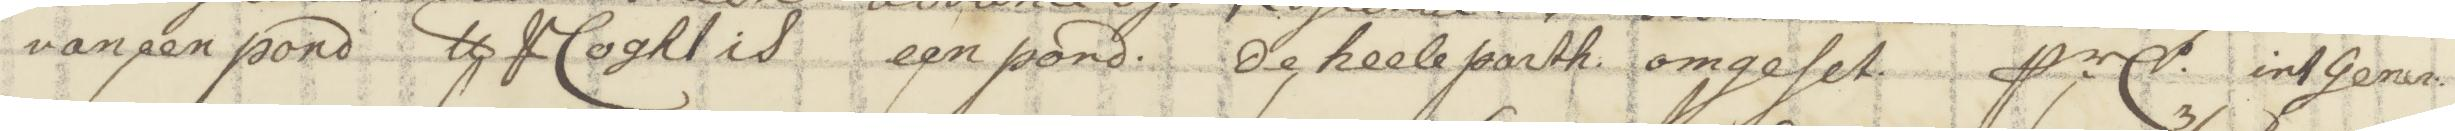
van een pond lb vercoght is een pond. de heele parth. omgeset p„r C.o int Gener:
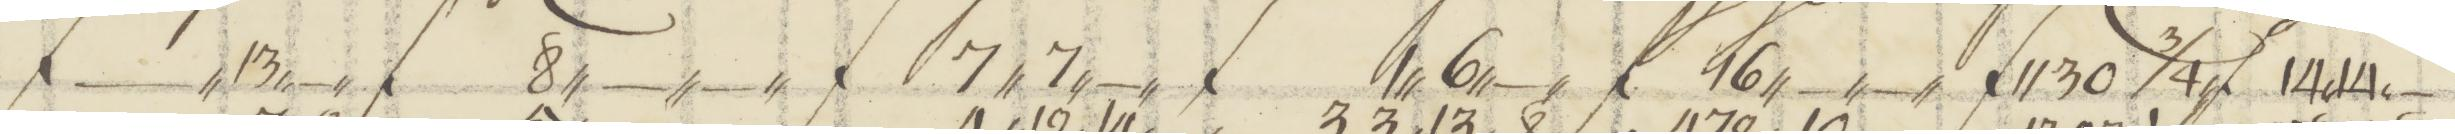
ƒ —„ 13„ —„ ƒ 8„ —„ —„ ƒ 7„ 7„ —„ ƒ 1„ 6„ —„ ƒ 16„ —„ —„ ƒ 1130 3/4„ ƒ 14„14„ —
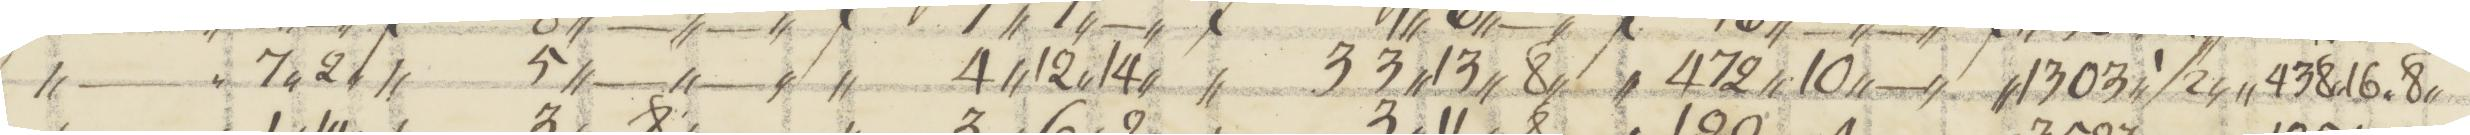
„ —„ 7„ 2„ „ 5„ —„ —„ „ 4„ 12„ 14„ „ 33„ 13„ 8„ „ 472„ 10„ —„ „ 1303„ 1/2„ „ 438„ 16„ 8„
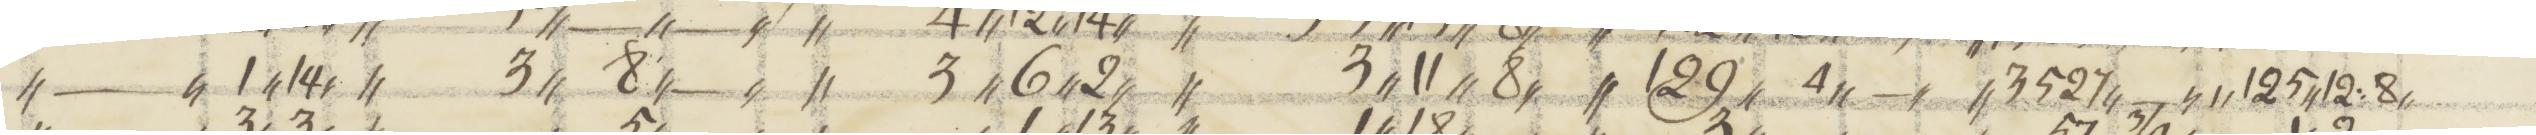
„ —„ 1„ 14„ „ 3„ 8„ —„ „ 3„ 6„ 2„ „ 3„ 11„ 8„ „ 129„ 4„ —„ „ 3527„ —„ „ 125„ 12„ 8„
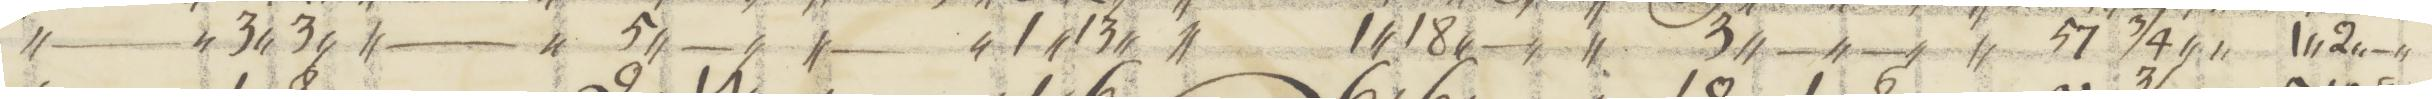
„ —„ 3„ 3„ „ —„ 5„ —„ „ —„ 1„ 13„ „ 1„ 18„ —„ „ 3„ —„ —„ „ 57 3/4„ „ 1„ 2„ —„
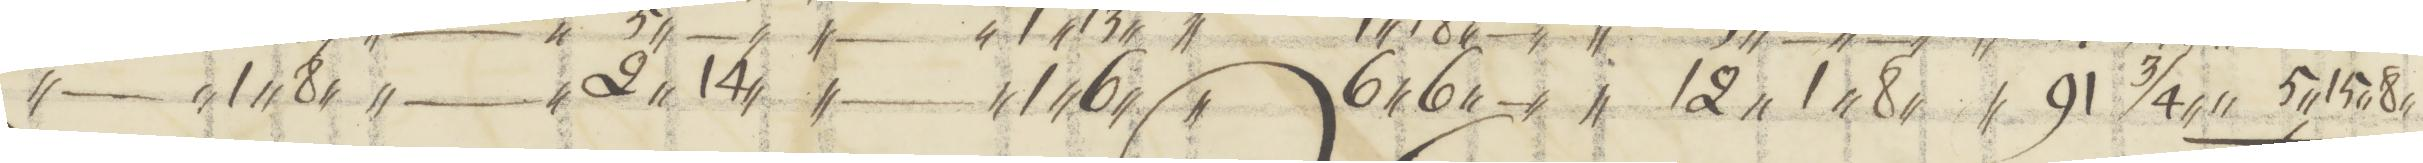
„ —„ 1„ 8„ „ —„ 2„ 14„ „ —„ 1„ 6„ „ 6„ 6„ —„ „ 12„ 1„ 8„ „ 91 3/4„ „ 5„ 15„ 8„
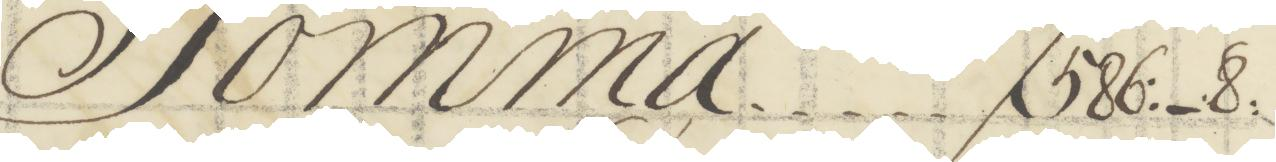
Somma - - - - - ƒ 586: —: 8:
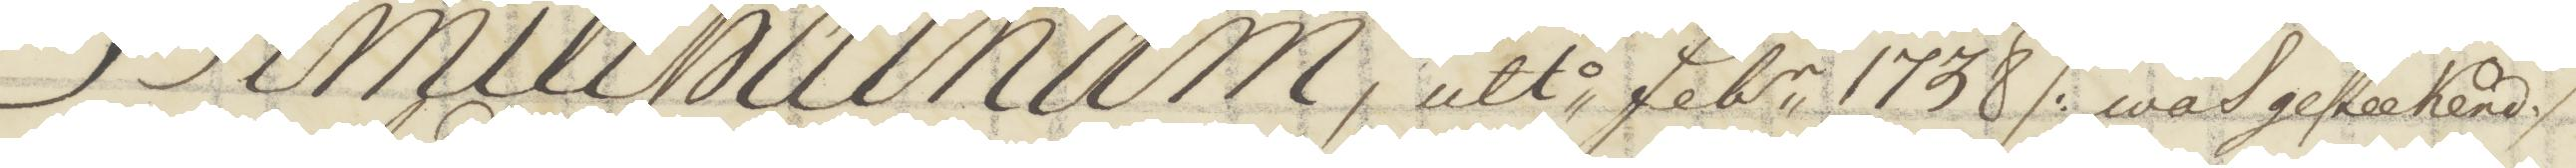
Bimilipatnam, ult„o feb„r 1738 /:was geteekend:/
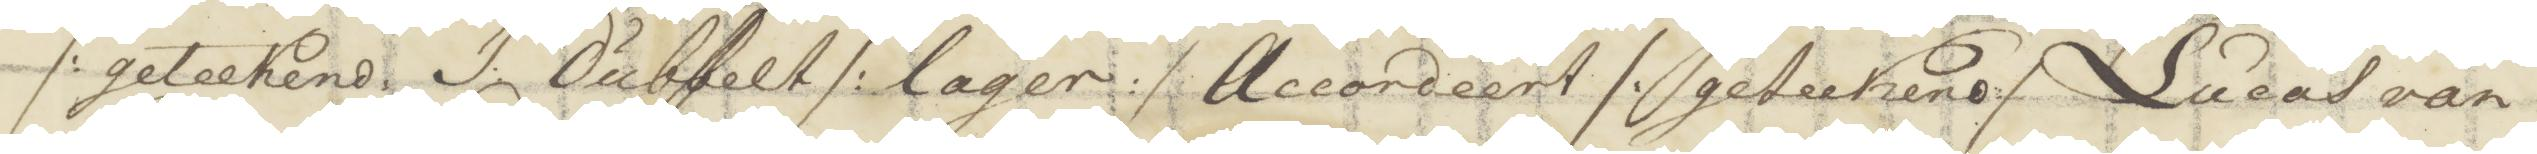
/:geteekend: I: dubbelt /:lager:/ Accordeert /:geteekend:/ Lucas van
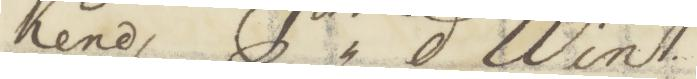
Kend, P„r d Wint
